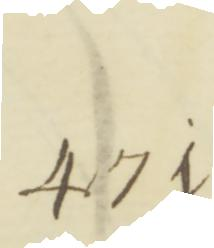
471
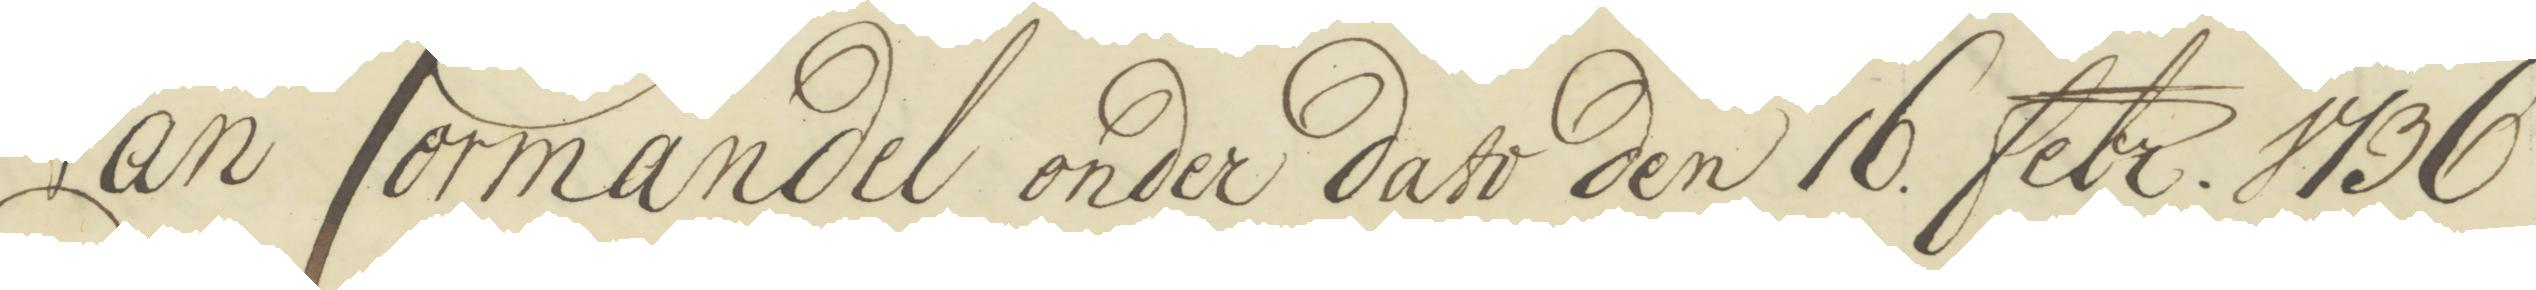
Van Cormandel onder dato den 16. febr. 1736
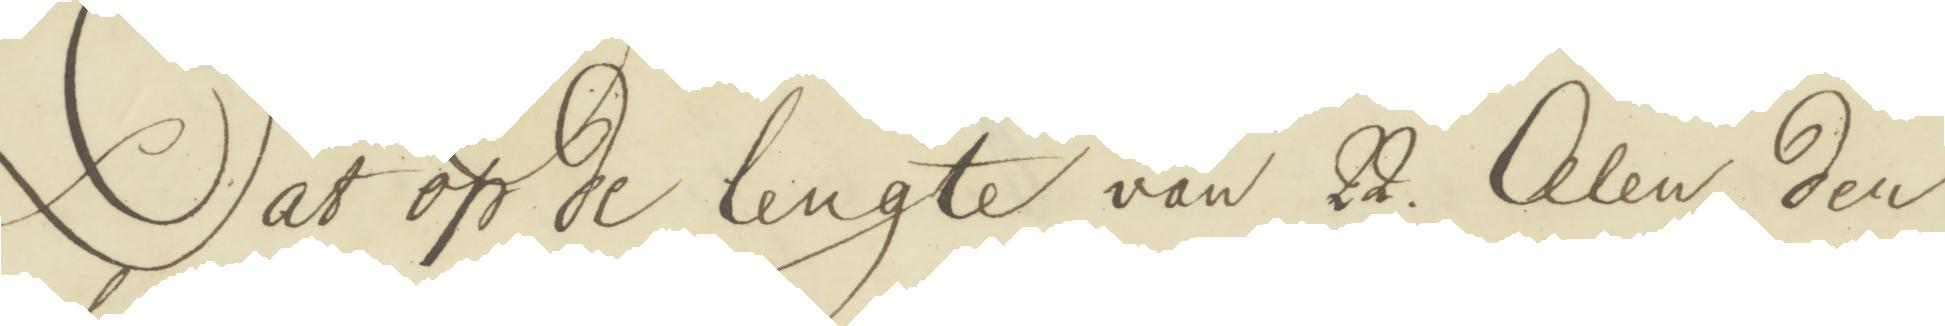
Dat op de lengte van 22. Celen den
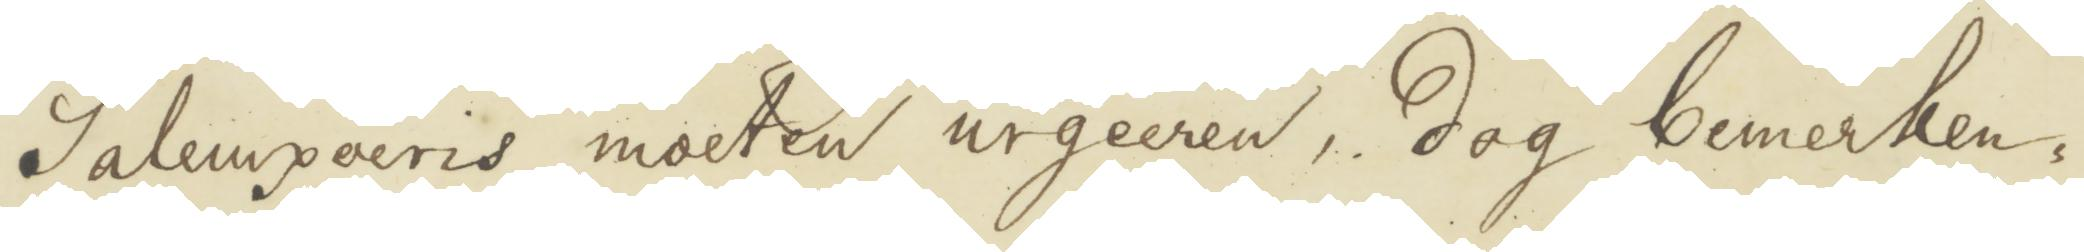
Salempoeris moeten urgeeren, dog bemerken„
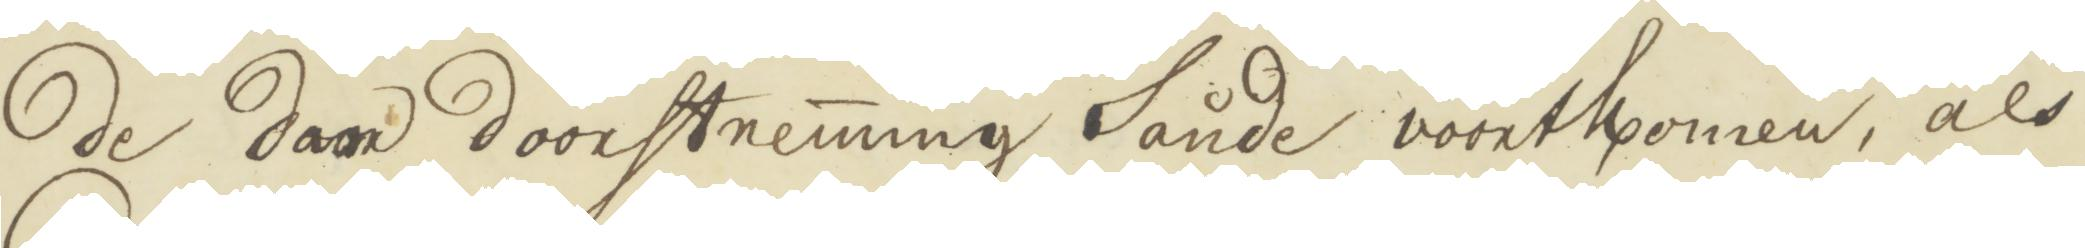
de daar doorstreming Soude voortkomen, als
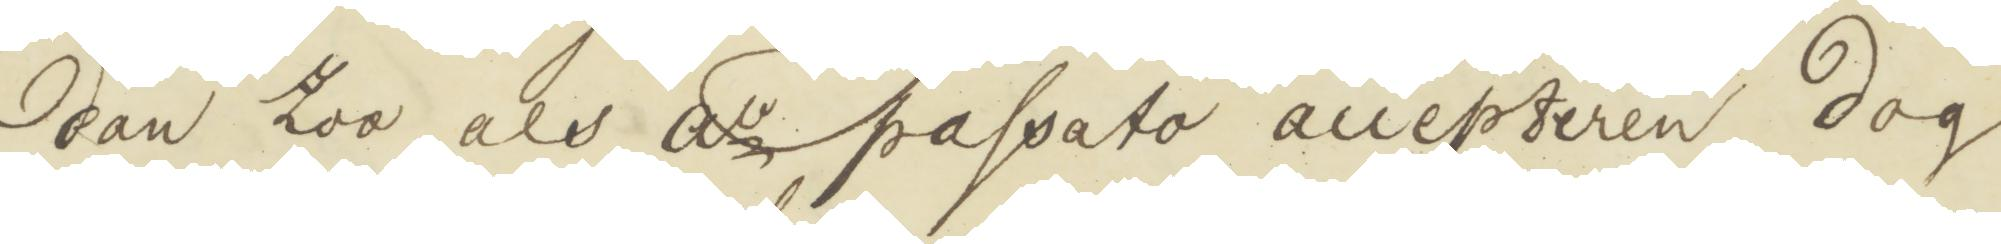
dan Zoo als a=o passato accepteren dog
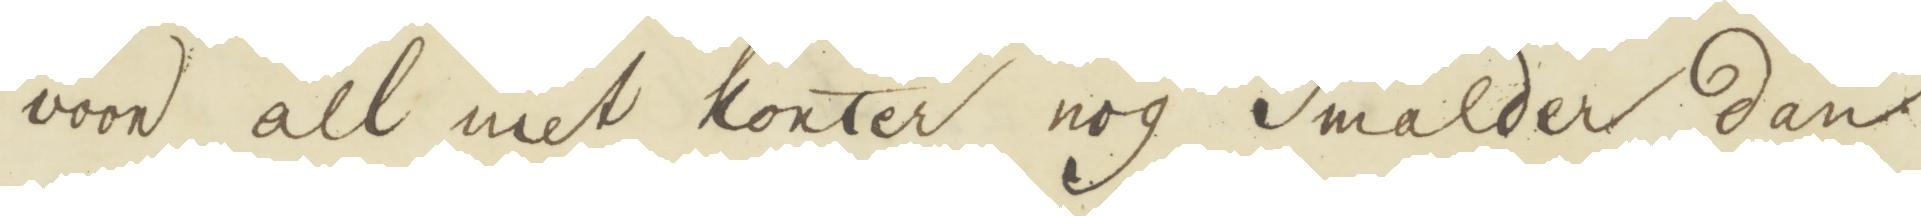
voor all niet korter nog Smalder dan
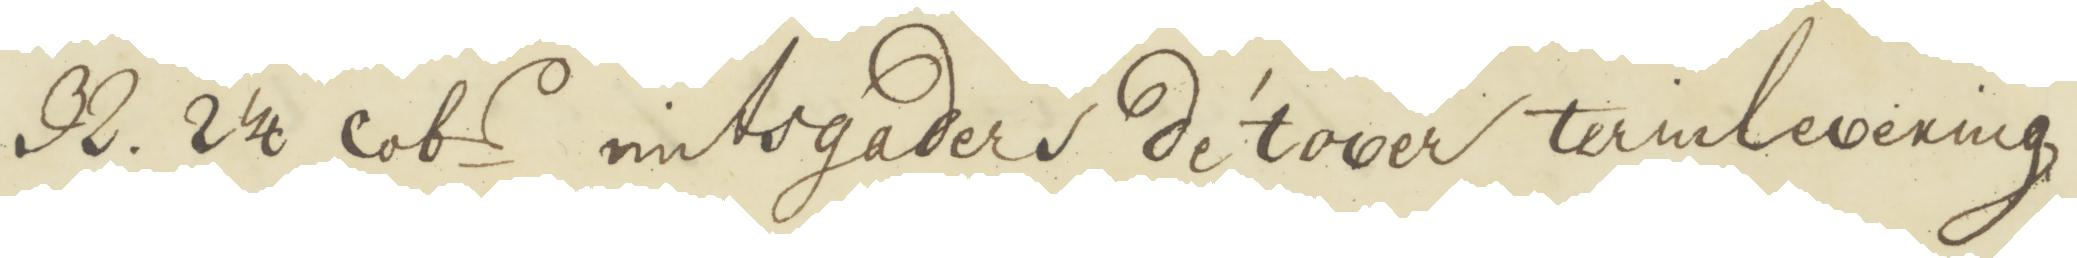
32. 2¼ cob=s mitsgaders de 't over ter inlevering
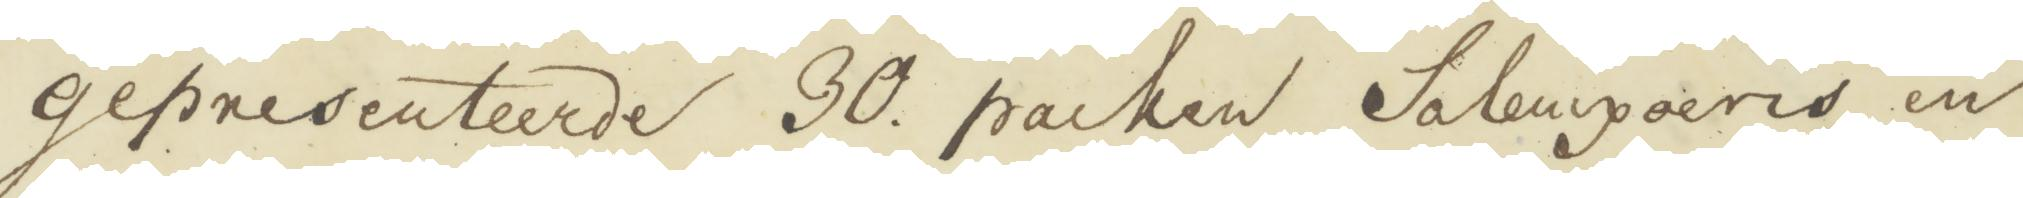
gepresenteerde 30. packen Salempoeris en
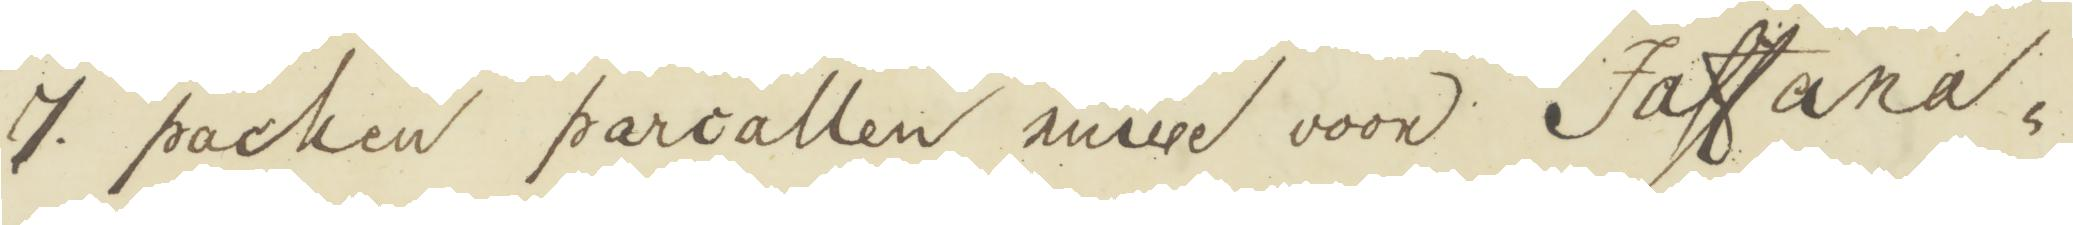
7. packen parcallen ruwe voor Jaffana„
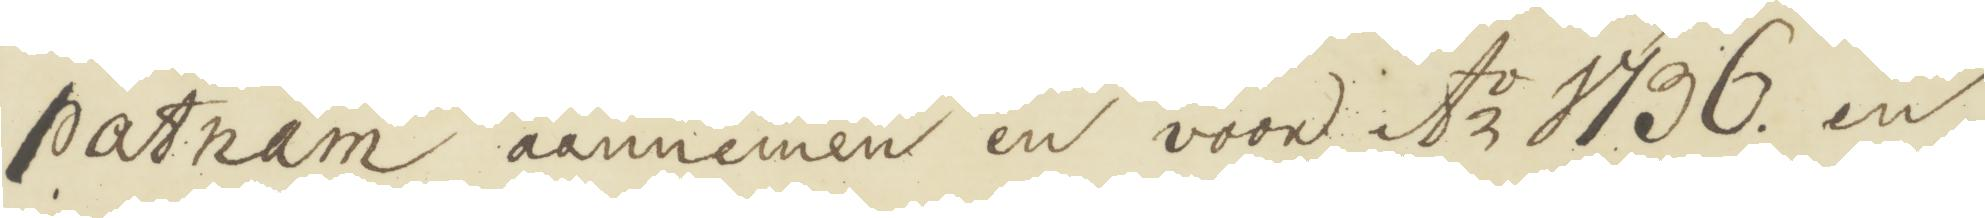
patnam aannemen en voor A„o 1736. en
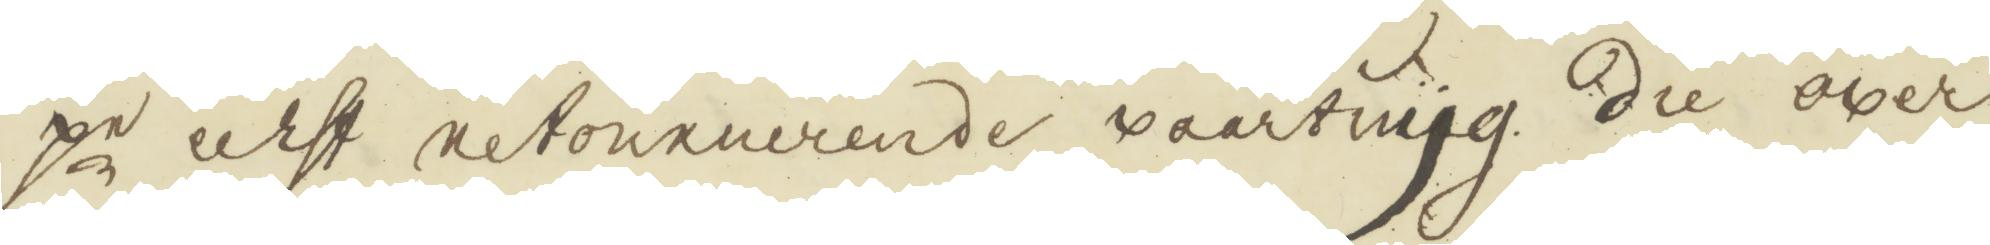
p„r eerst retournerende vaartuijg die over
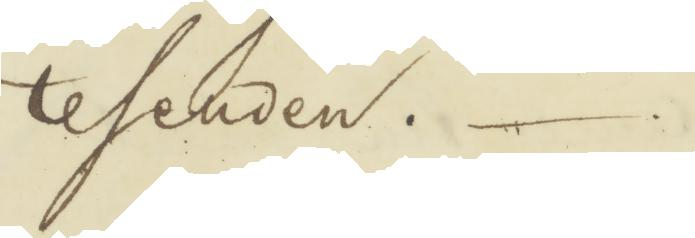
tesenden. —.
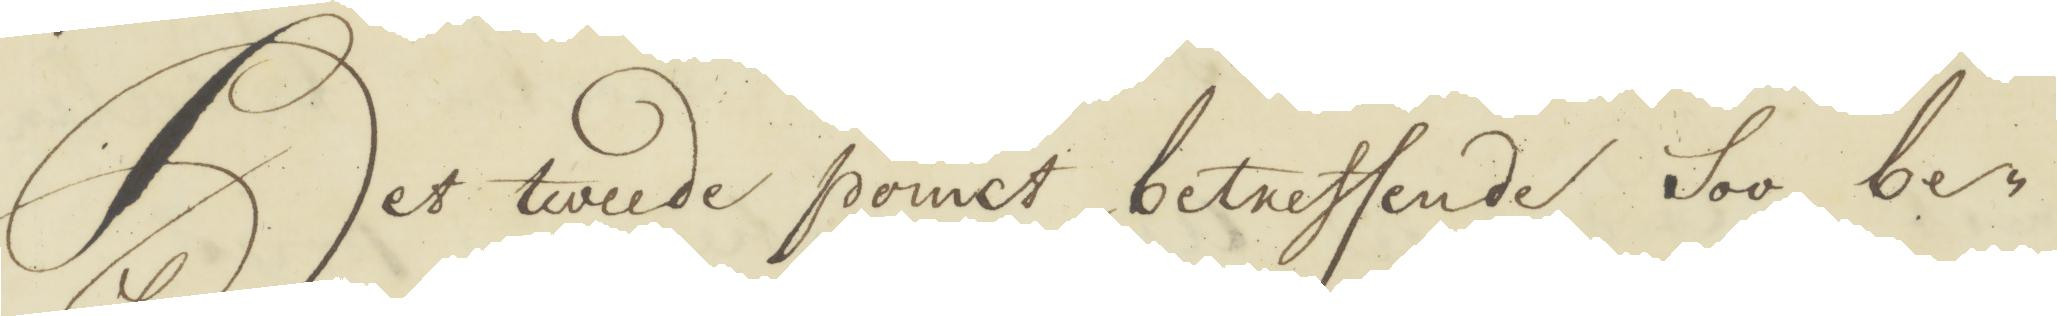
Het tweede poinct betreffende Soo be„
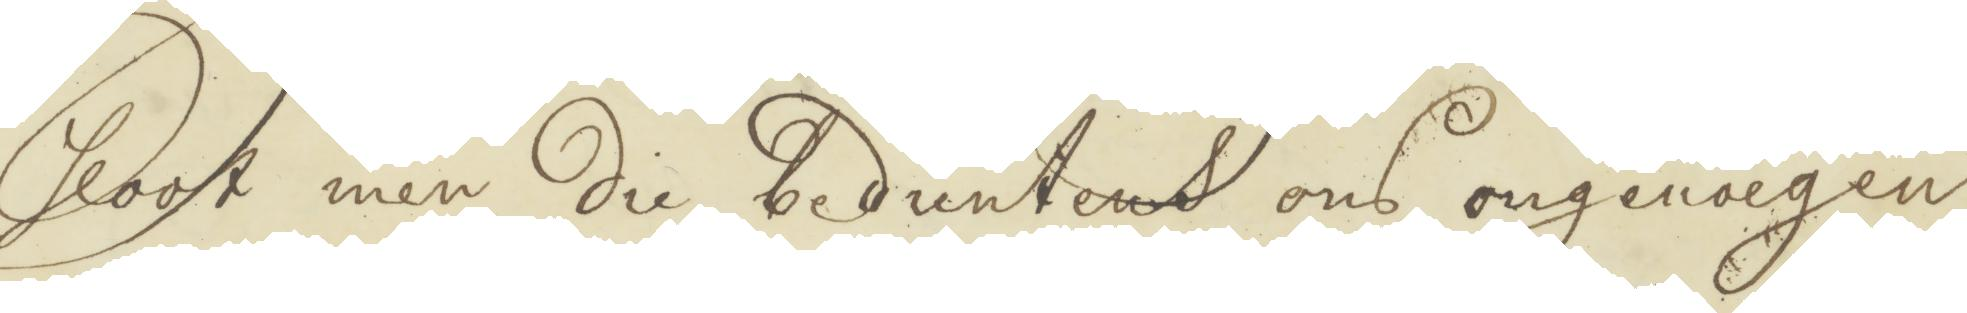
sloot men die bedientens ons ongenoegen
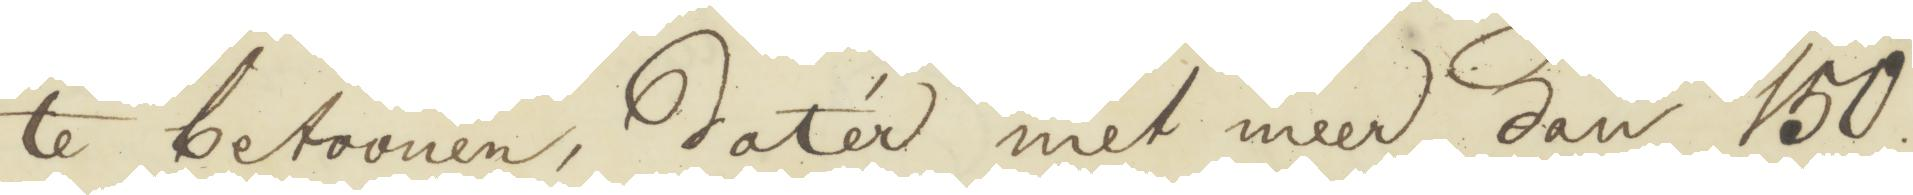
te betoonen, dat'er niet meer dan 150.
